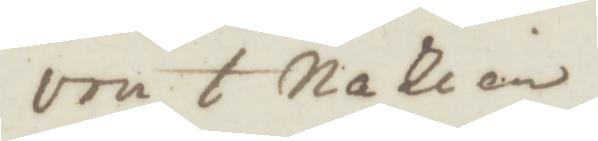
von ’t nazien
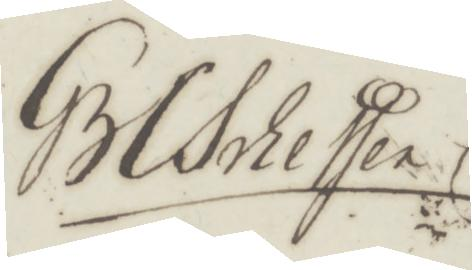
B C Scheffer
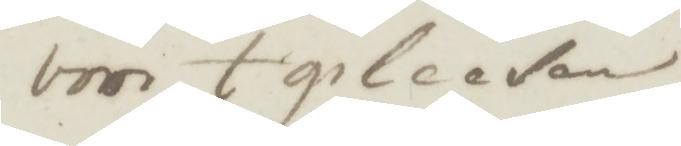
voor ’t geleesen
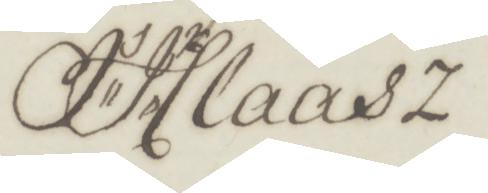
J„s J„r Claasz
